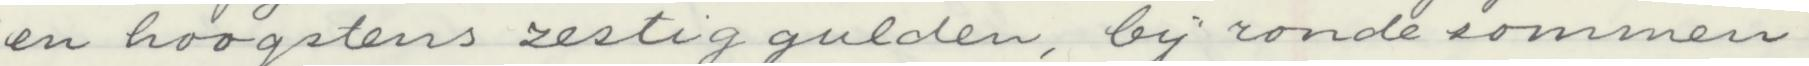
en hoogstens zestig gulden, bij ronde sommen
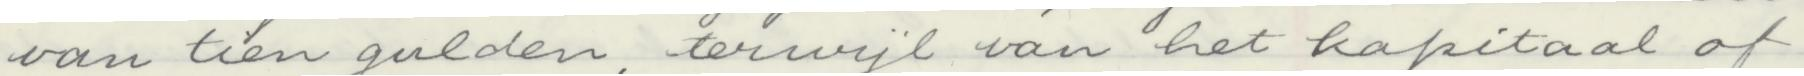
van tien gulden, terwijl van het kapitaal of
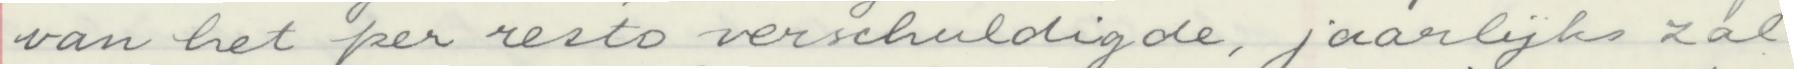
van het per resto verschuldigde, jaarlijks zal
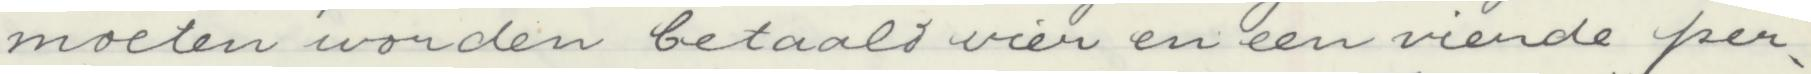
moeten worden betaald vier en een vierde per
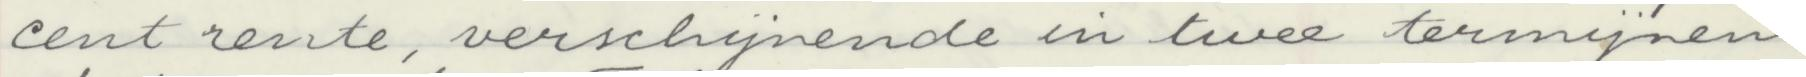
cent rente, verschijnende in twee termijnen
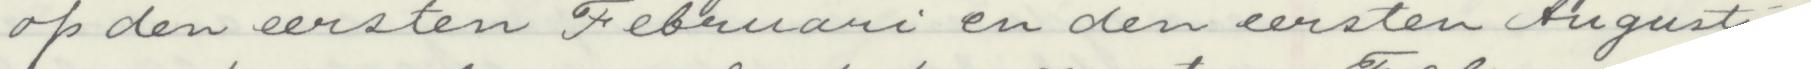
op den eersten Februari en den eersten Augustus
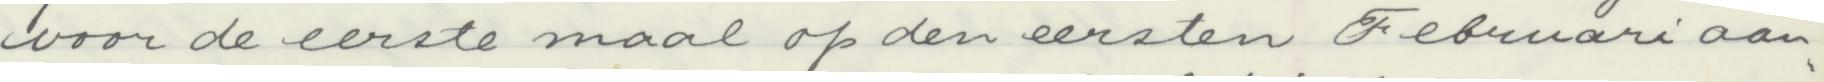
voor de eerste maal op den eersten Februari aan
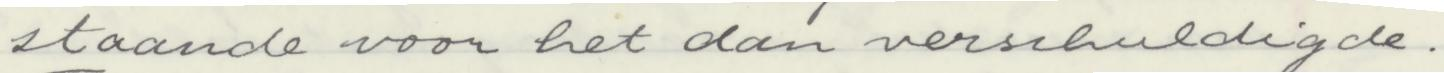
staande voor het dan verschuldigde.
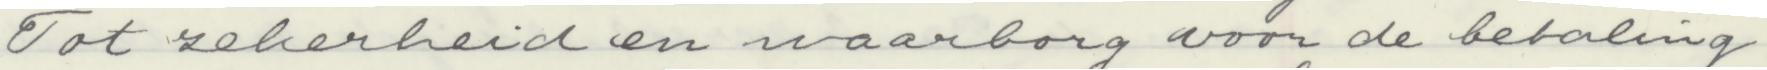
Tot zekerheid en waarborg voor de betaling
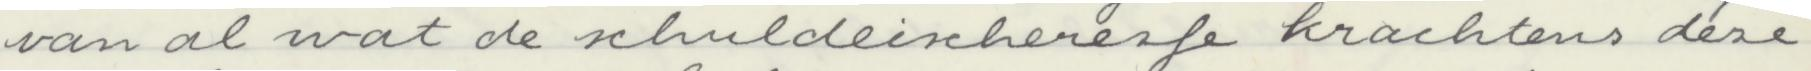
van al wat de schuldeischeresse krachtens deze
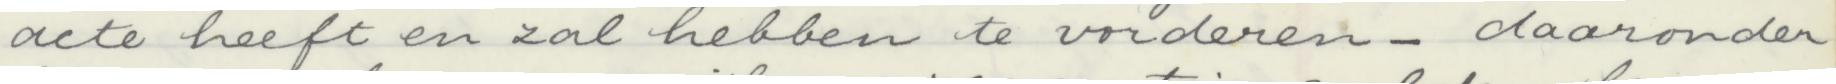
acte heeft en zal hebben te vorderen - daaronder
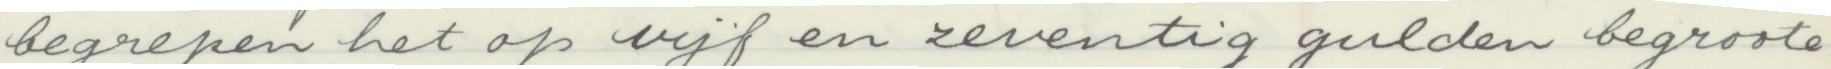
begrepen het op vijf en zeventig gulden begroote
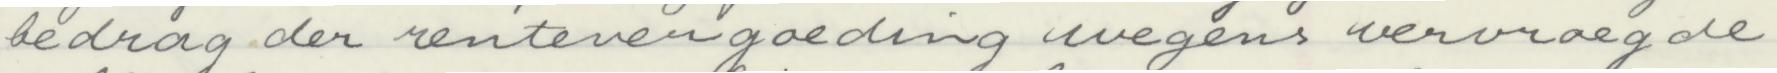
bedrag der rente vergoeding wegens vervroegde
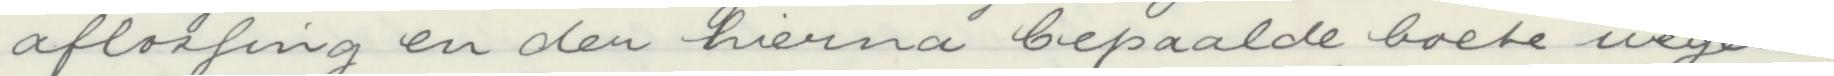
aflossing en den hierna bepaalde boete wegens
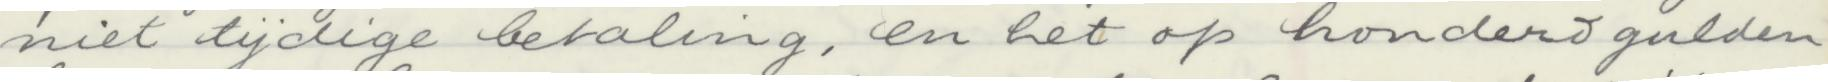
niet tijdige betaling, en het op honderd gulden
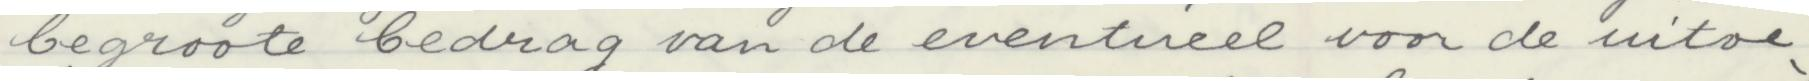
begroote bedrag van de eventueel voor de uitoe
